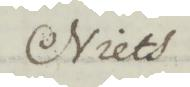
Niets
